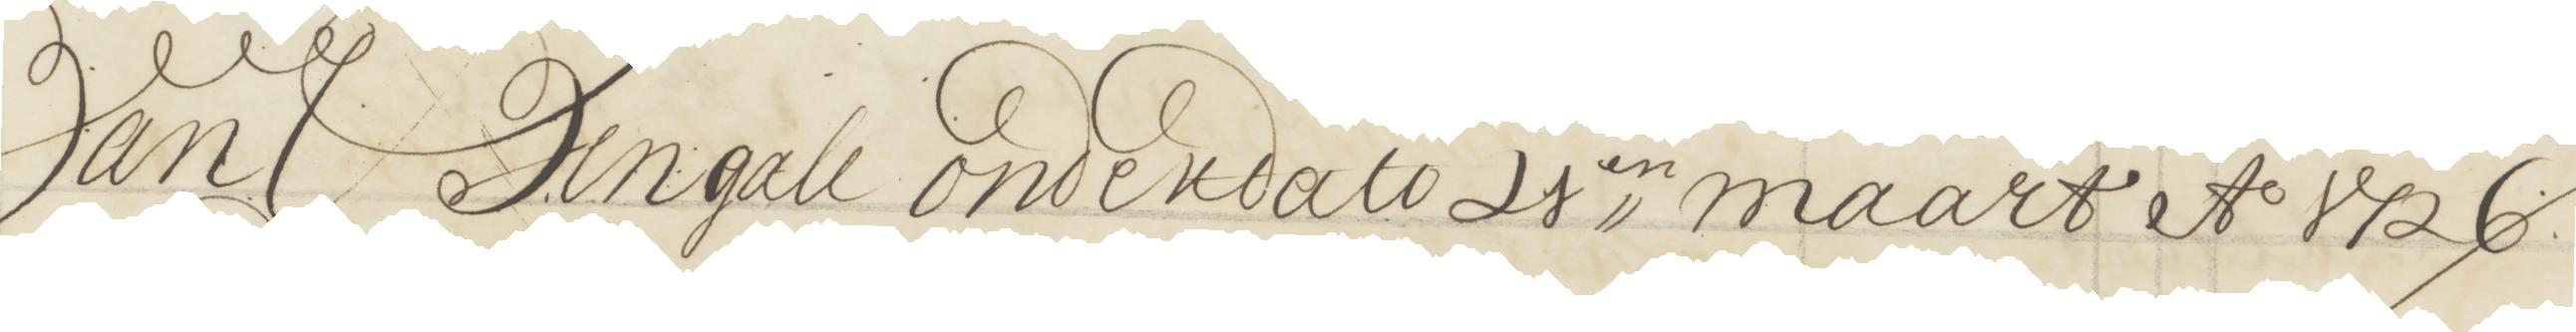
Van Bengale onder dato 21„en maart Ao 1726:
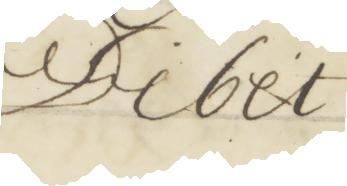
Debet
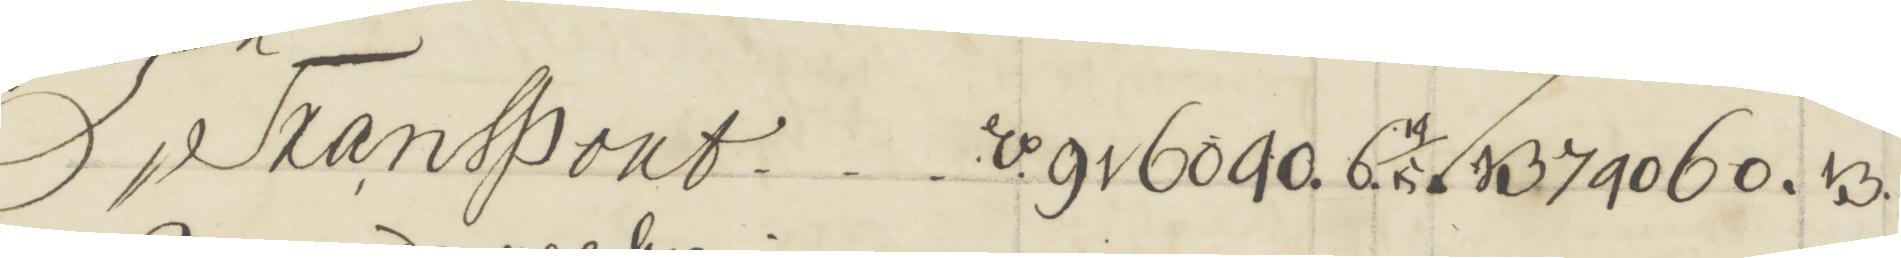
P„r Transport - - - R.o 916040. 6.14/15 ƒ 1374060. 13.
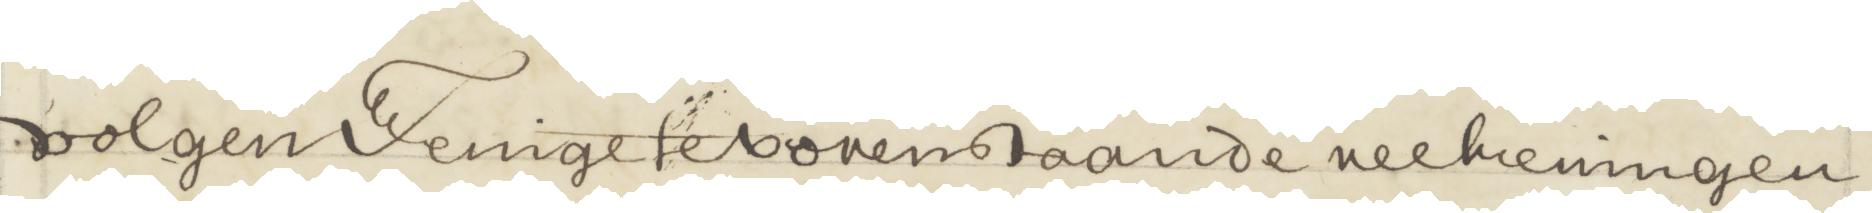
volgen Eenige te vorenstaande reekeningen
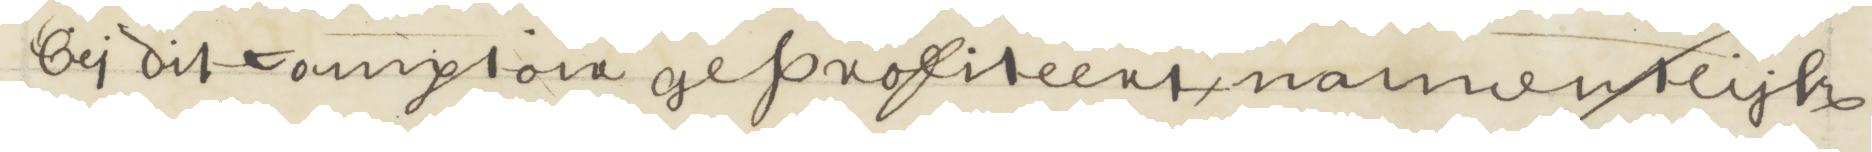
bij dit comptoir geprofiteert, namentlijk
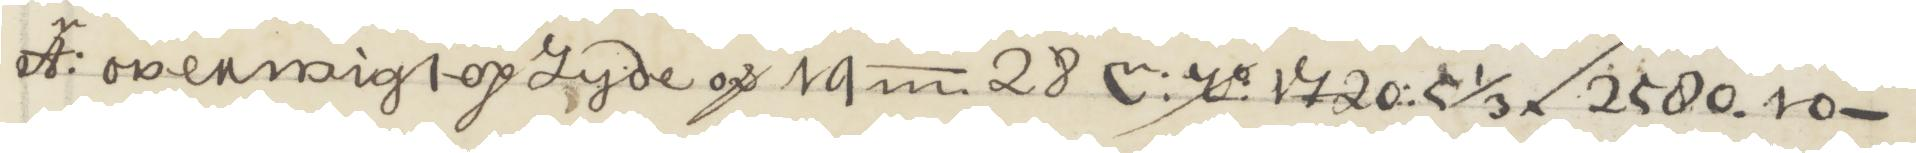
A:r overwigt op Zijde over 14 m 28 Vr: R:o 1720: 5 1/3 ƒ 2580. 10 —
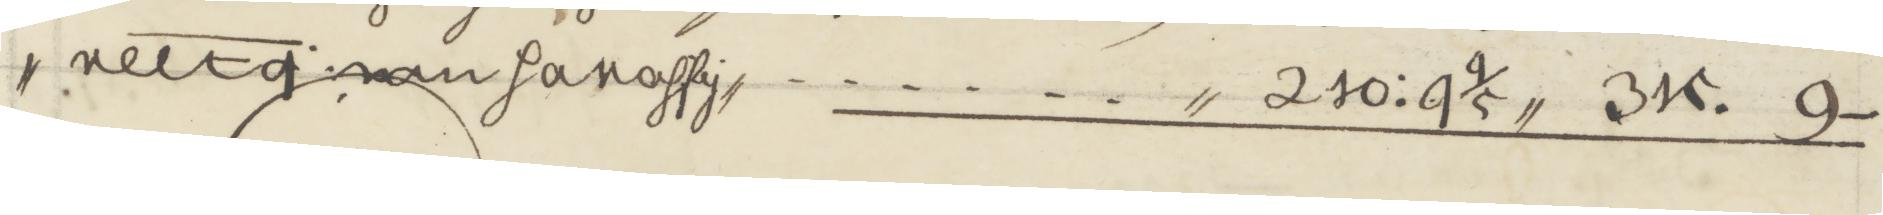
„ reecq: van sarossij „ - - - - - - „ 210: 4 4/5 „ 315. 9 —
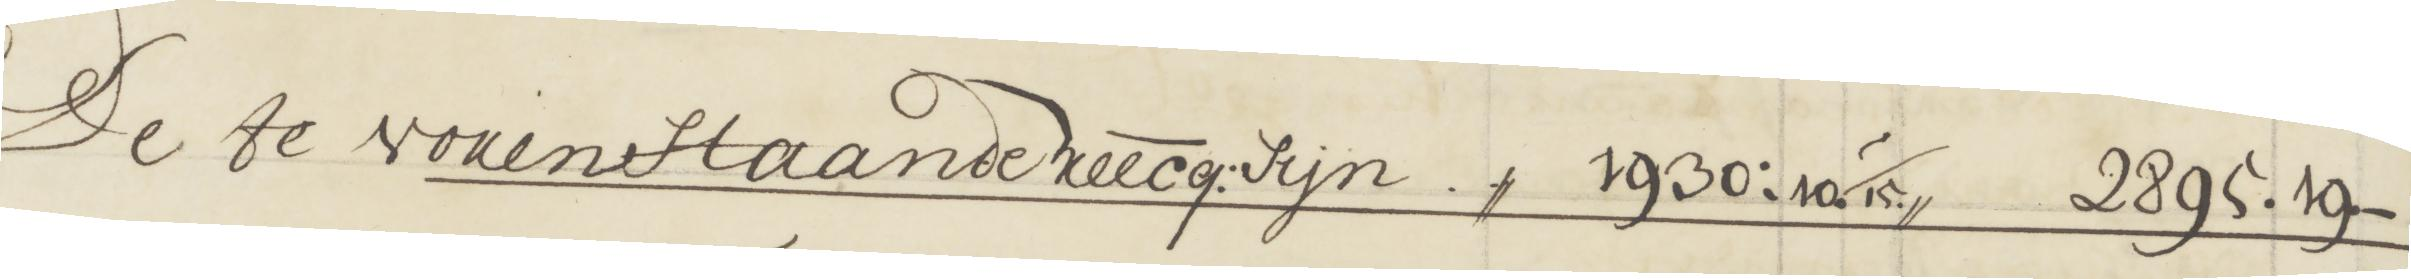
De te vorenstaande reecq: sijn. „ 1930: 10. 1/15. „ 2895. 19. —
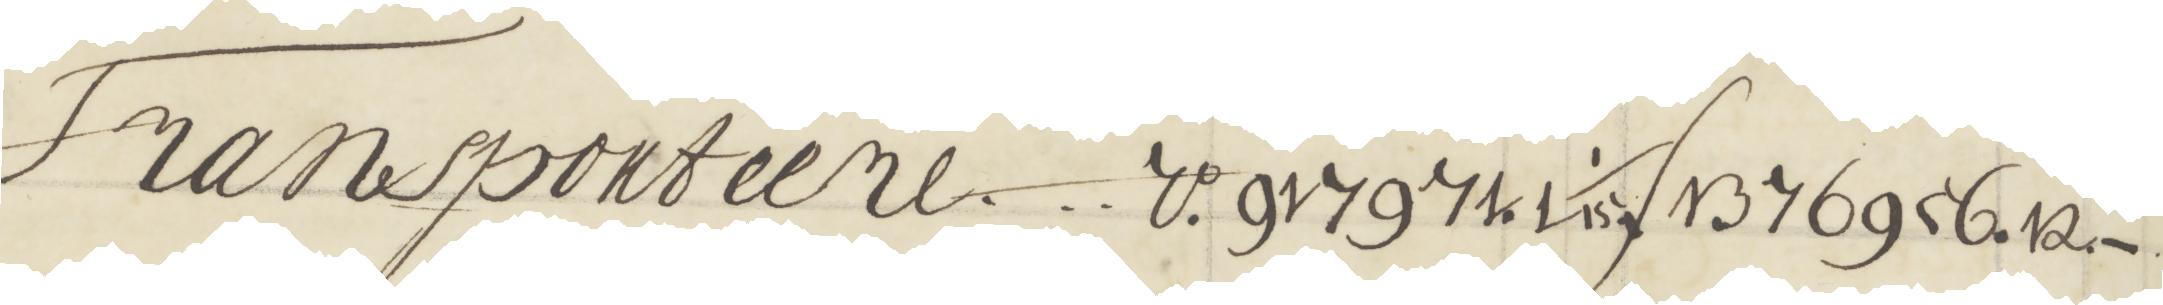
Transporteere - - - „ R.o 917971. 1 1/15 ƒ 1376956. 12. —
